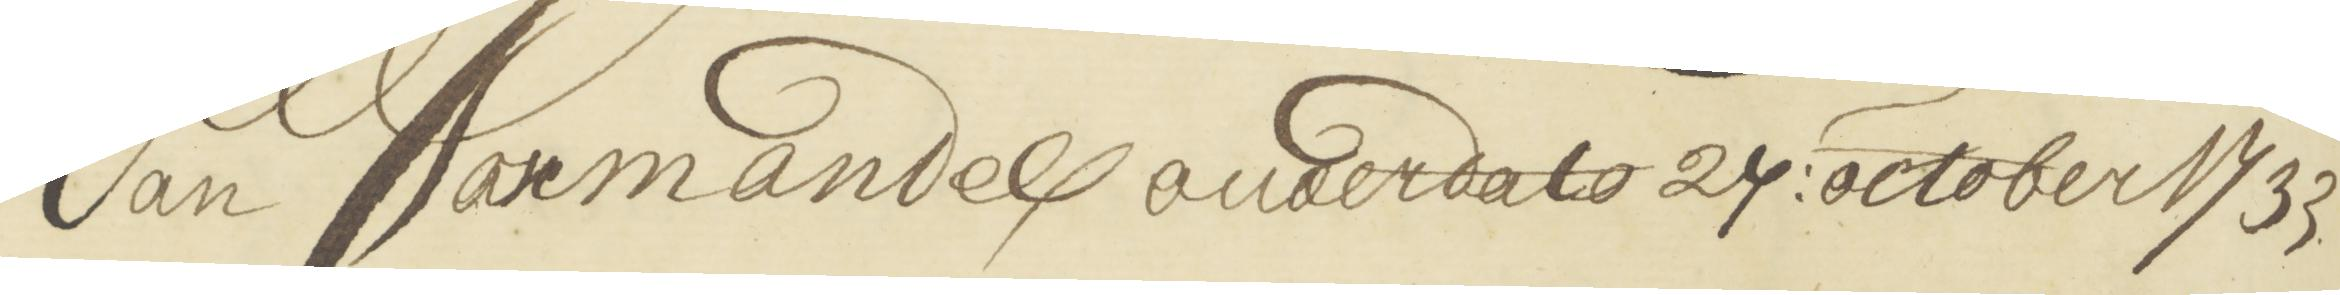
Van Cormandel onderdato 27:' october 1733.
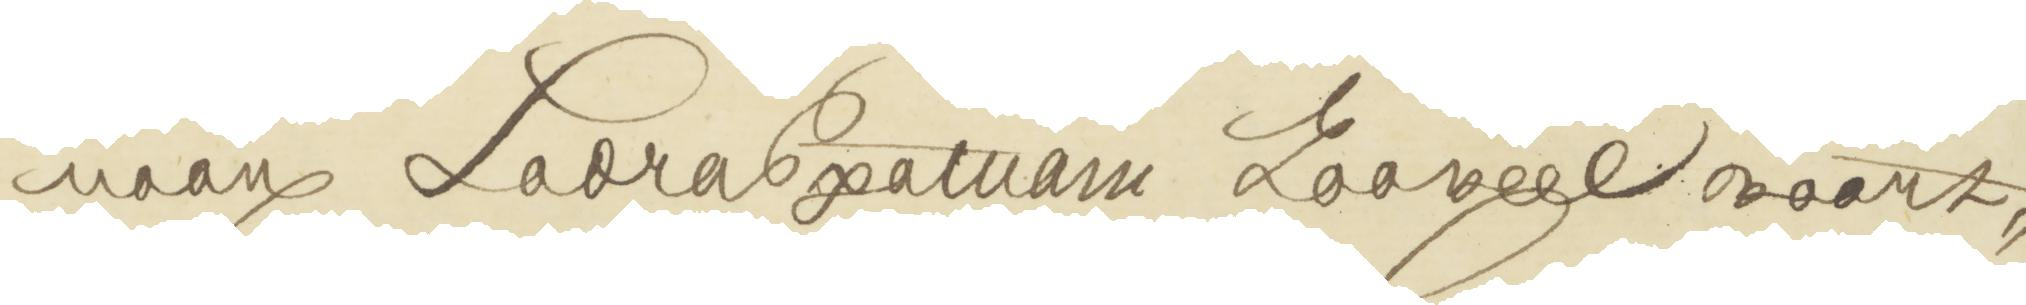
naar Sadraspatnam zooveel voort„
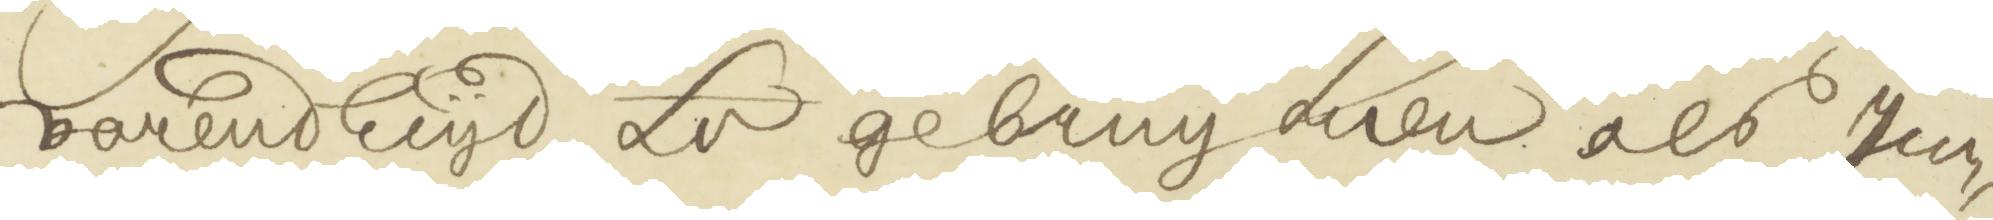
varendheijd te gebruijken als jm
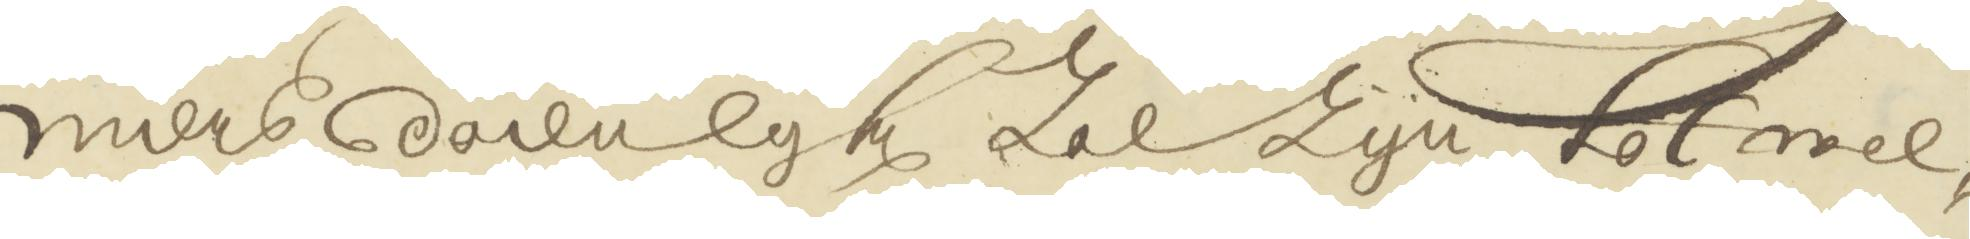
mers daerlijk zal zijn tot wel„
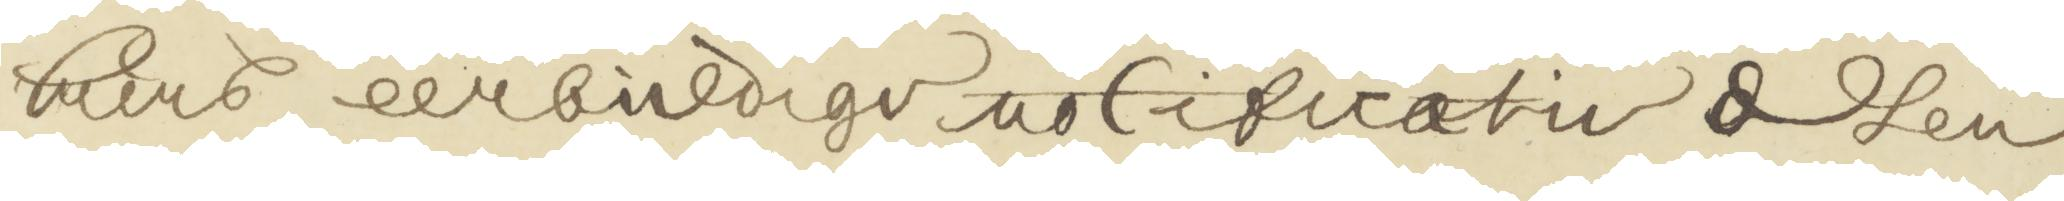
kers eerbiedige notificatie deser
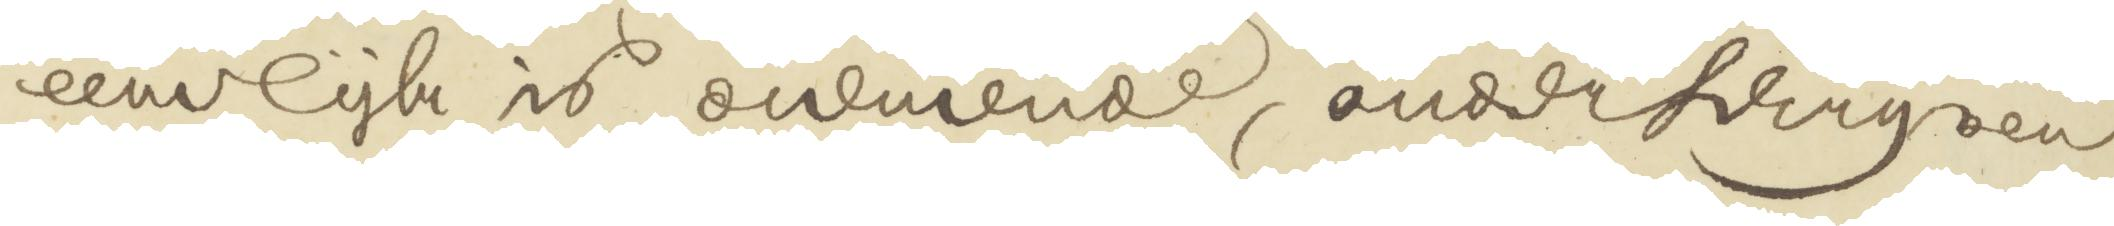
eenelijk is diemende, onderschrijven
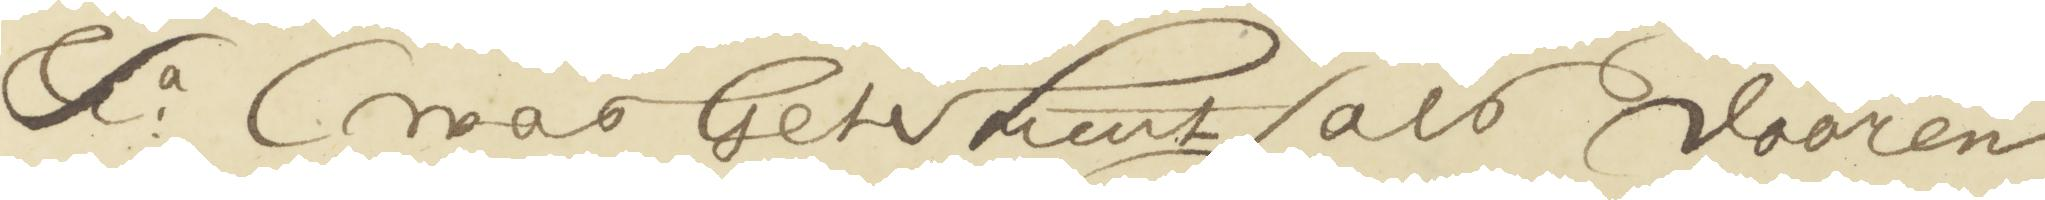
Et:a (was getekent) als vooren
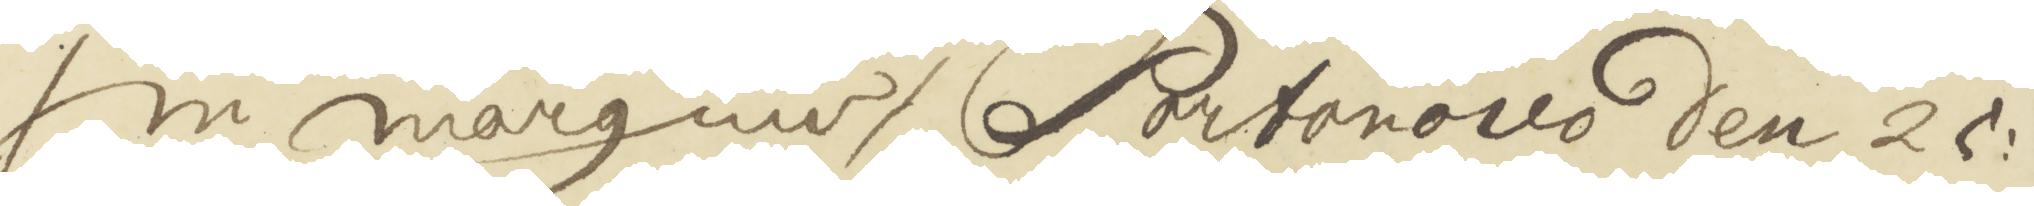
(in margine) Portonovo den 25:
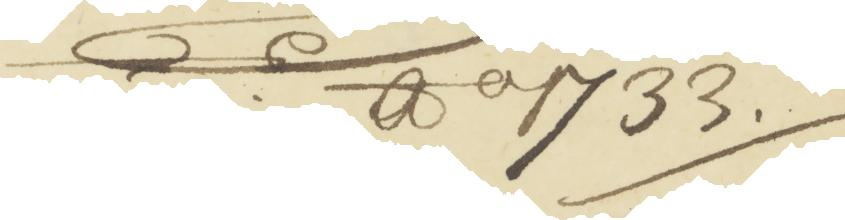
aug:s Ao 1733./
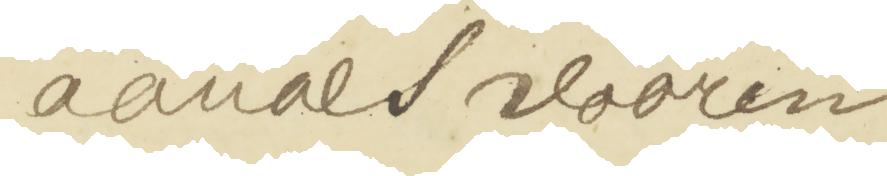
aanals vooren
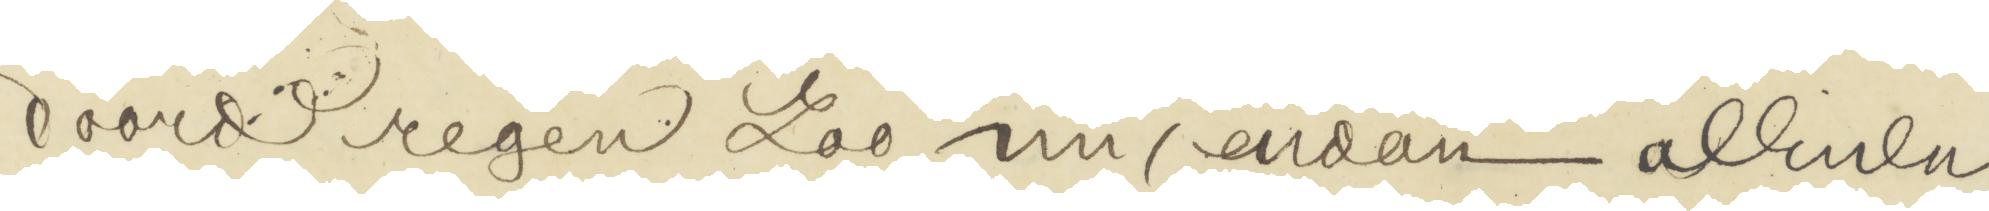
doorde regen zoo nu, endan alhier
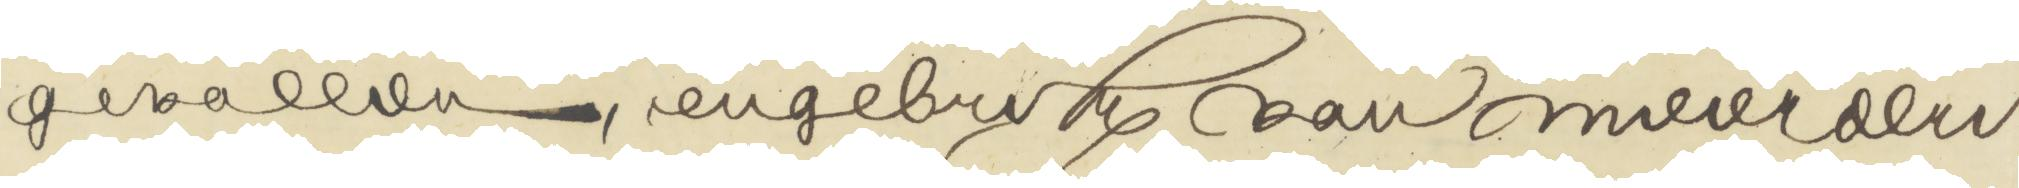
gevallen, engebrek van meerdere
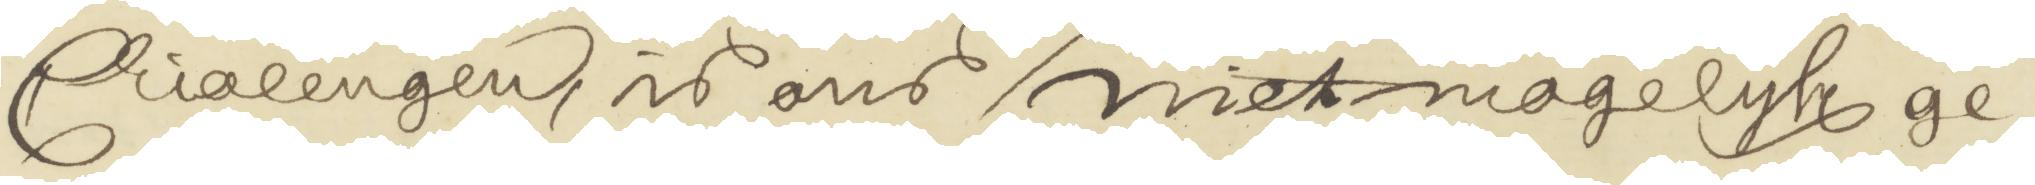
Chialengen, is ons niet mogelijk ge
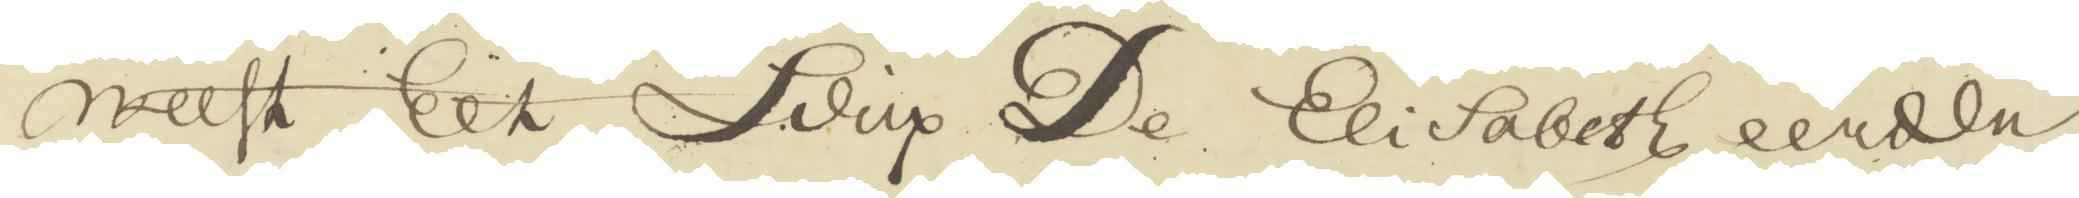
weest het schip De Elisabeth eerder
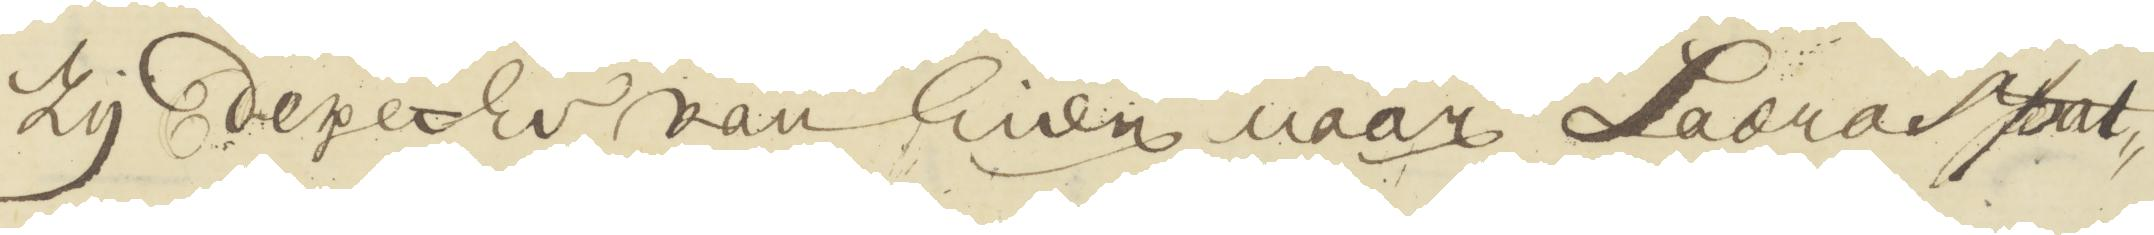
zij depeche van hier naar Sadraspat„
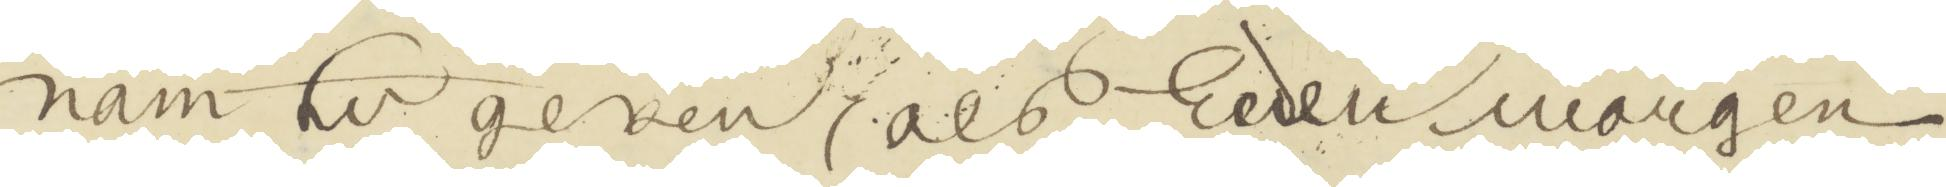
nam te geven (als heden morgen
